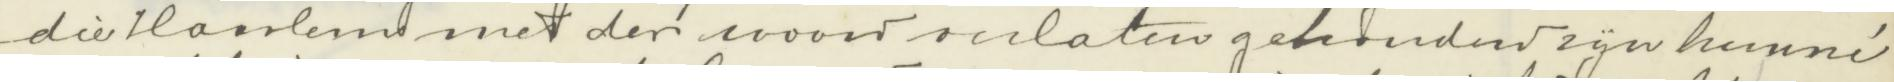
die Haarlem met der woon verlaten gehouden zijn hunne
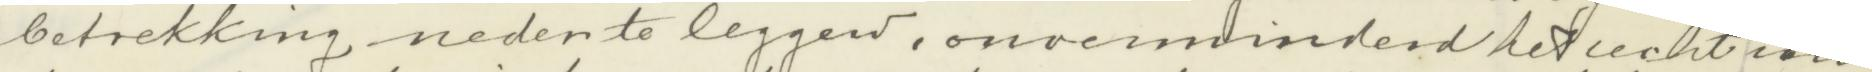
betrekking neder te leggen, onverminderd het recht |van
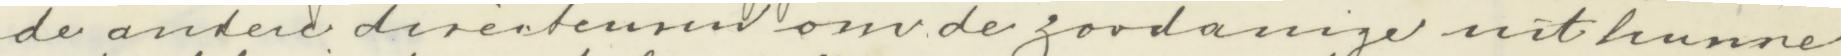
de andere directeuren om de zoodanige uit hunne
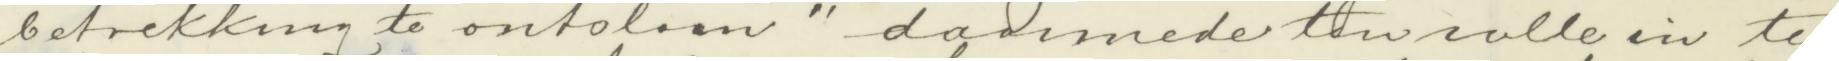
betrekking te ontslaan " daarmede ten volle in te-
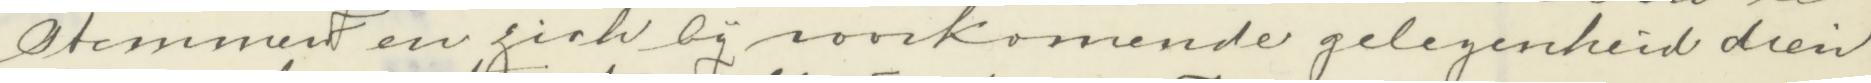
stemmen en zich bij voorkomende gelegenheid dien
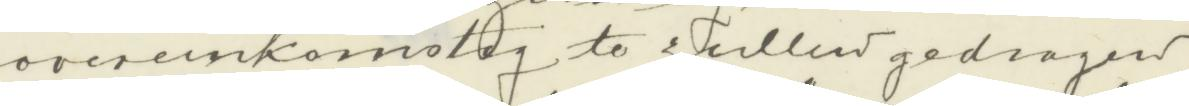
overeenkomstig te zullen gedragen
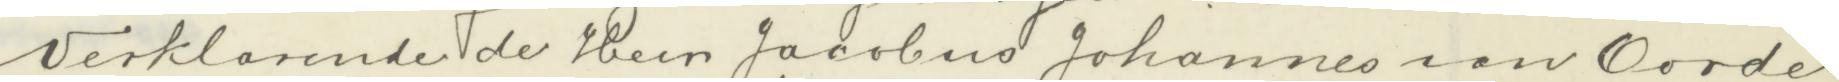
Verklarende de Heer Jacobus Johannes van Oorde
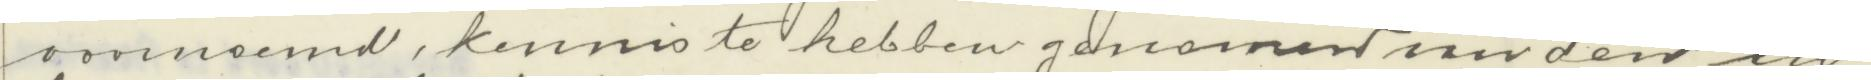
voornoemd, kennis te hebben genomen van den in
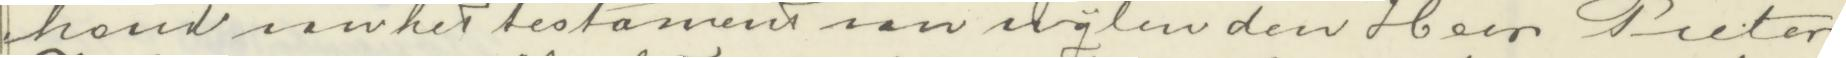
houd van het testament van wijlen den Heer Pieter
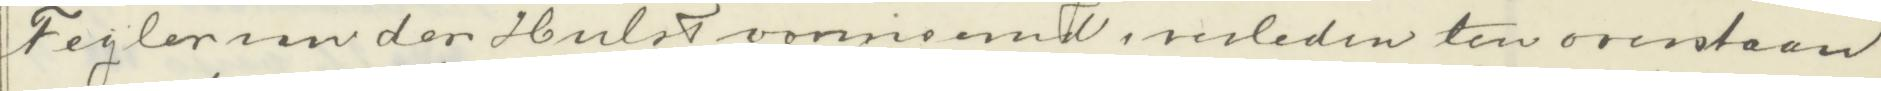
Teijler van der Hulst voornoemd, verleden ten overstaan
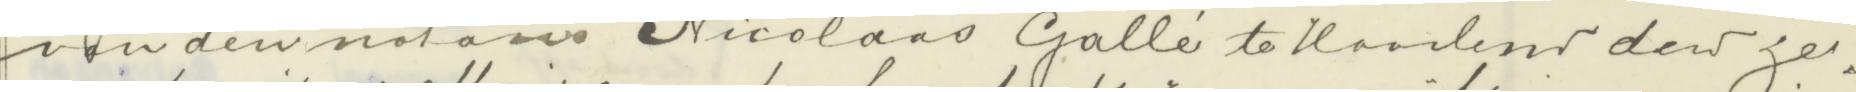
van den notaris Nicolaas Gallé te Haarlem den ze
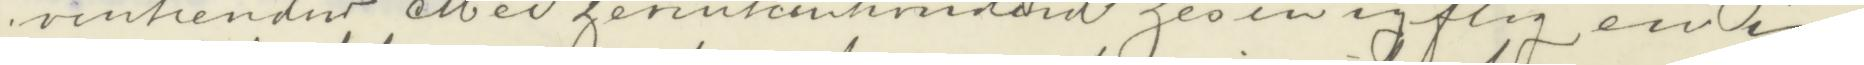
ventienden Mei zeventienhonderd zes en vijftig en in
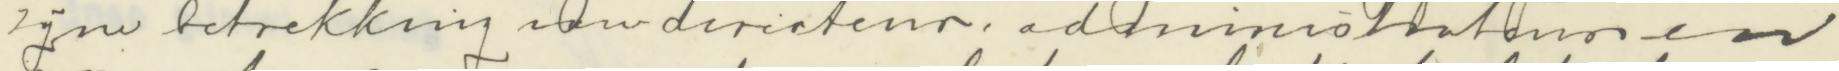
zijne betrekking van directeur, administrateur en
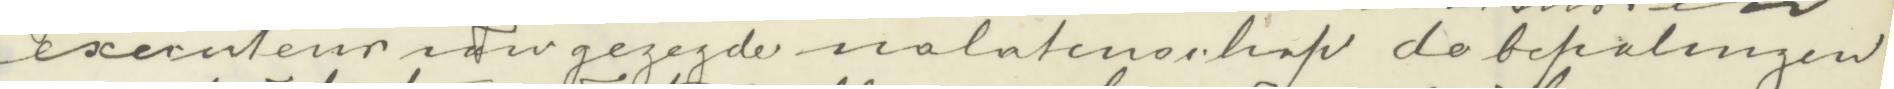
executeur van gezegde nalatenschap de bepalingen
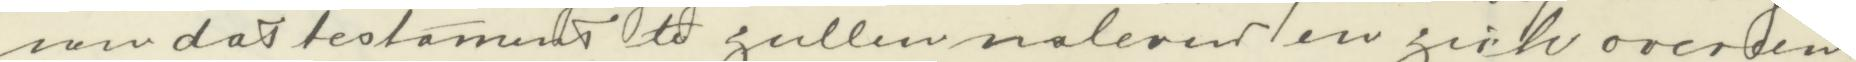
van dat testament te zullen naleven en zich overeen
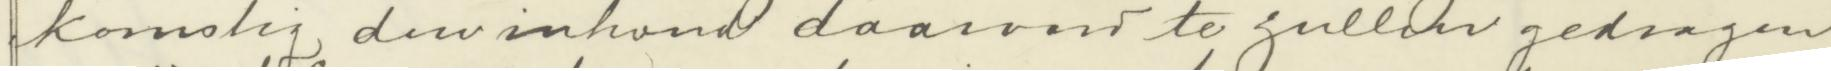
komstig den inhoud daarvan te zullen gedragen
